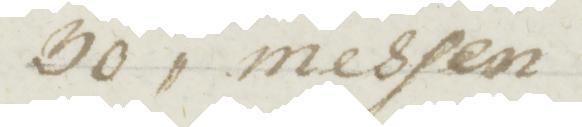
30 „ messen
